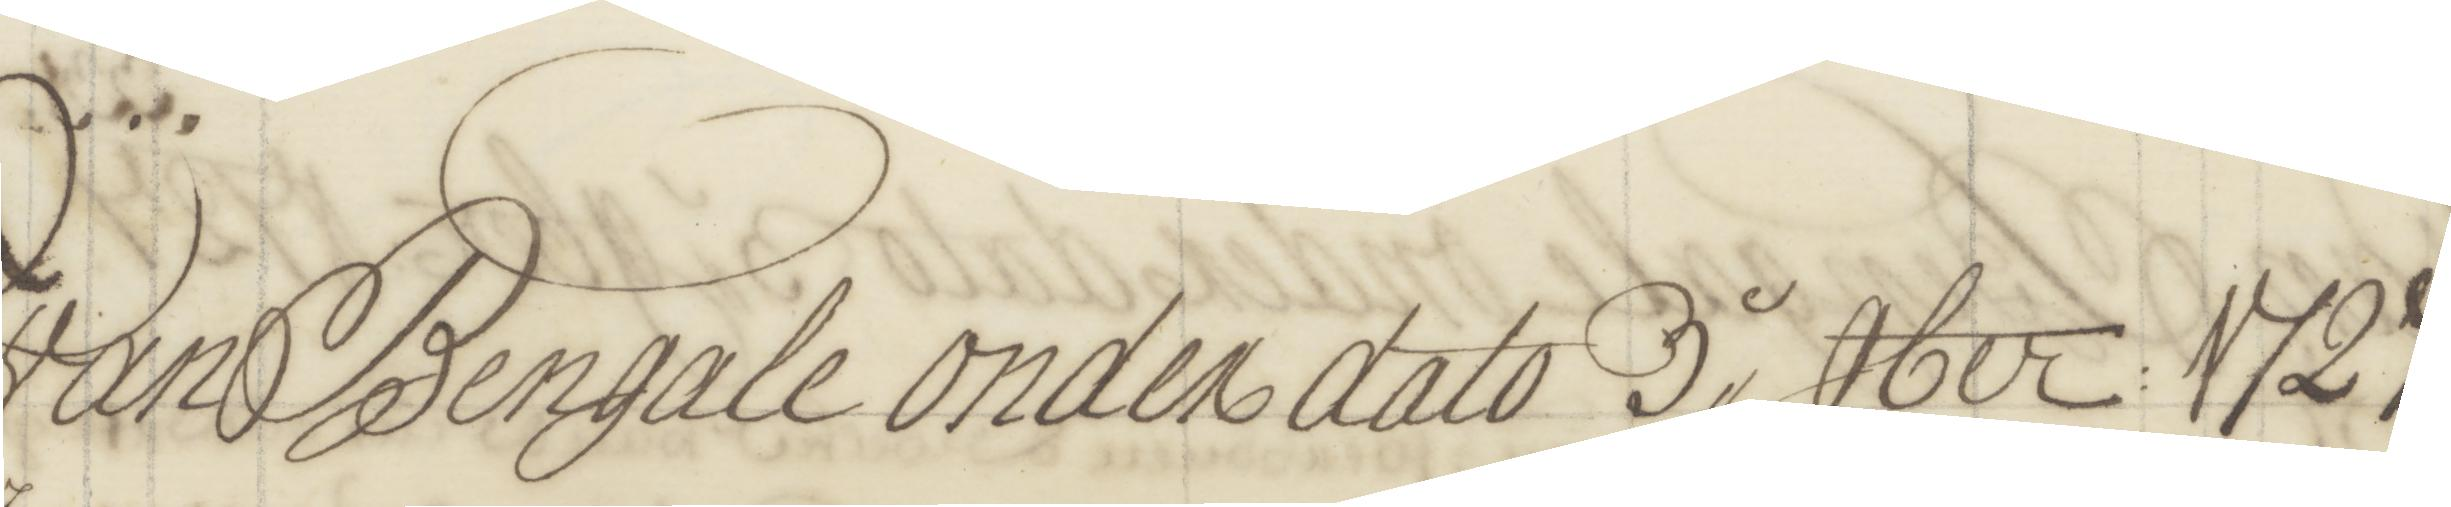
Van Bengale onder dato 3„e 9ber: 1727.
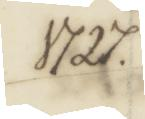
1727.
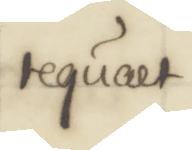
tequaet
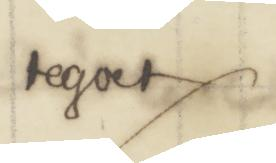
tegoet
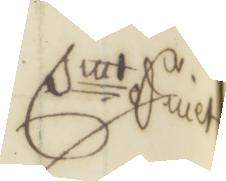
p=mt dsniet
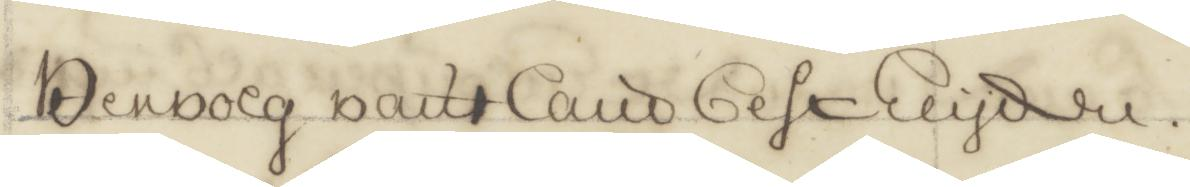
Vervolg van't land bescheijden
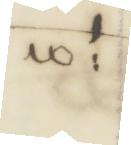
w:t
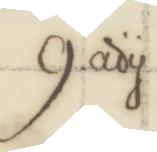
9.adij
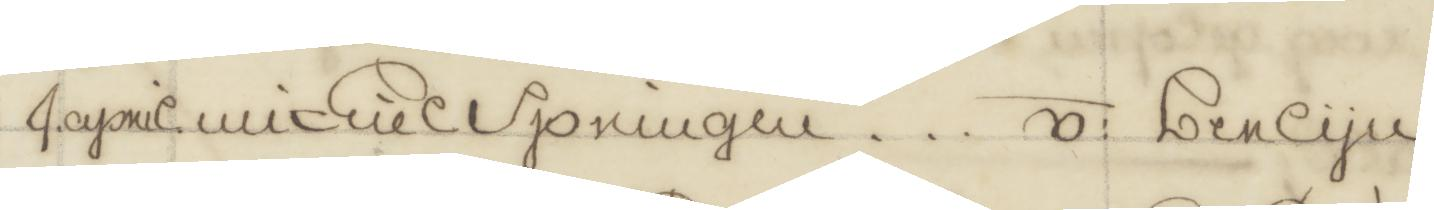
4.april michiel Springen . . . v: berlijn
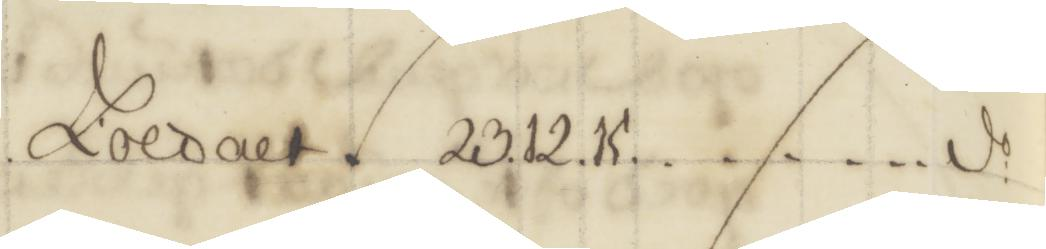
Zoldaet ƒ 23.12.15. . . . . . . d:o
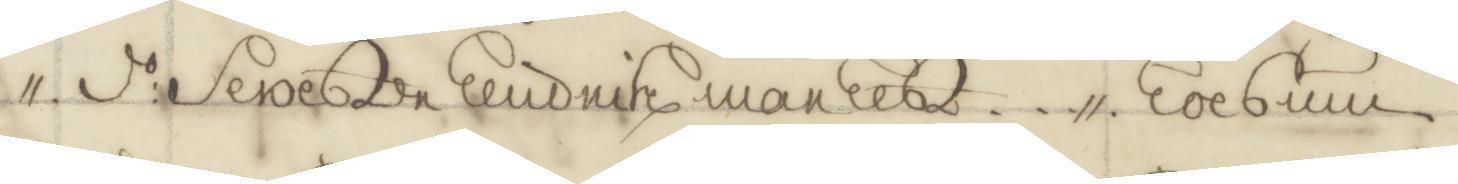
„. d:o Sevester hendrik marhesz . . . „ .hoesum
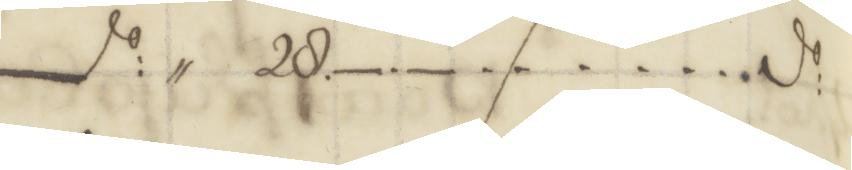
_:o „ 28. —.— . . . . . . . d:o
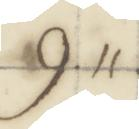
9: „
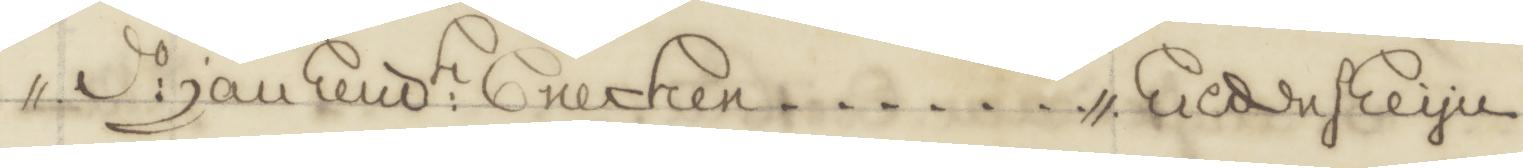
„. d:o jan hend:k brecker - - - - - - . „ . hildersheijn
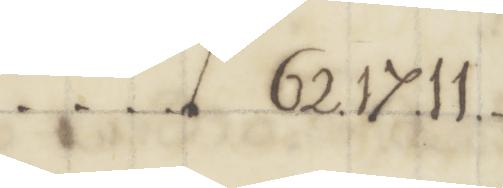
. . . . ƒ 62.17.11.
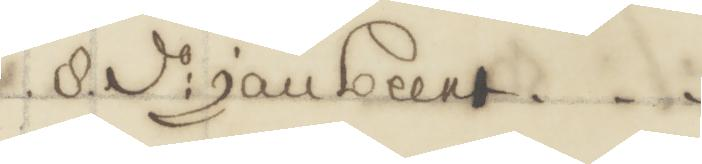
. 8. d:o jan beert . -
